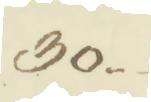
30„
